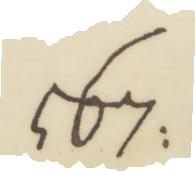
567.
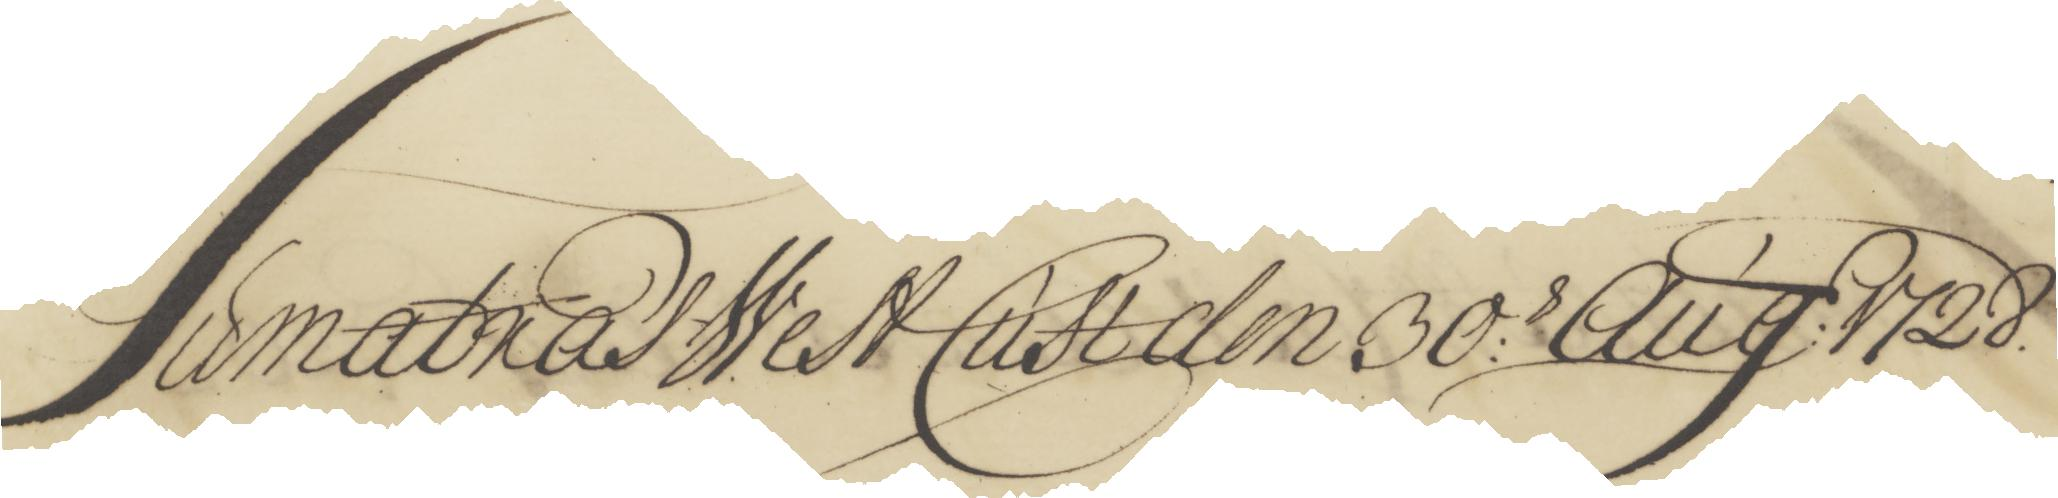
Sumatra's West Cust den 30:en Aug: 1728.
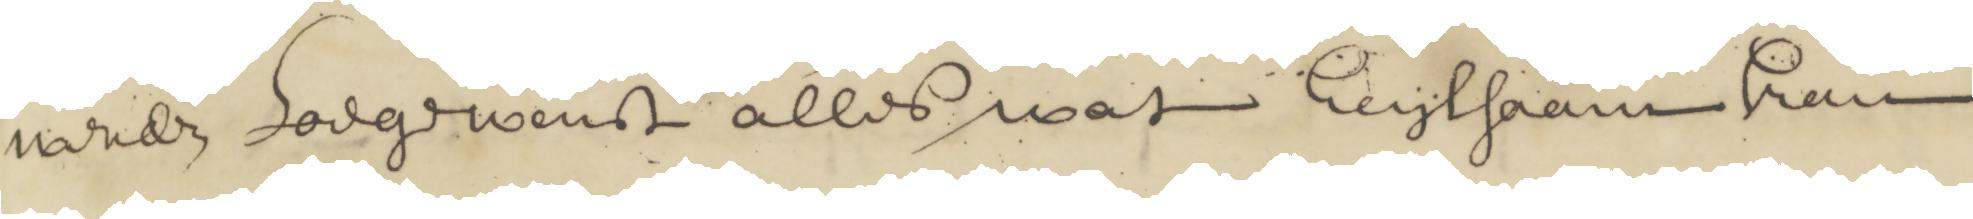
werden toegewenst alles wat heijlsaam kan
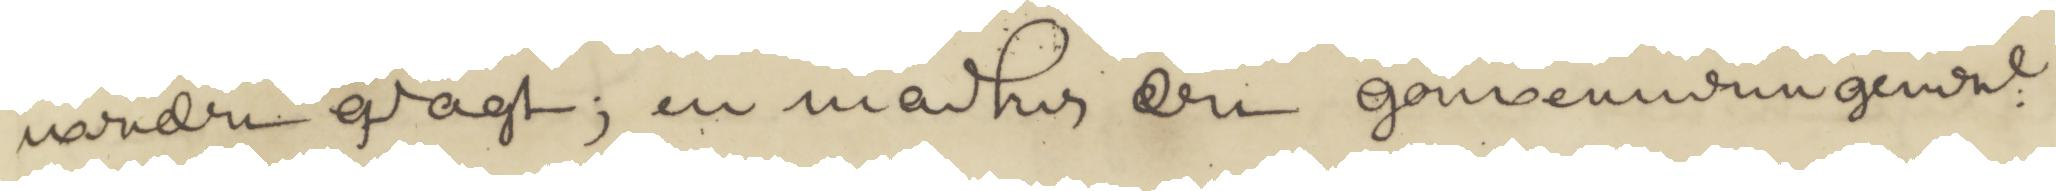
werden geagt; en maeken den gouvenneur gener:l
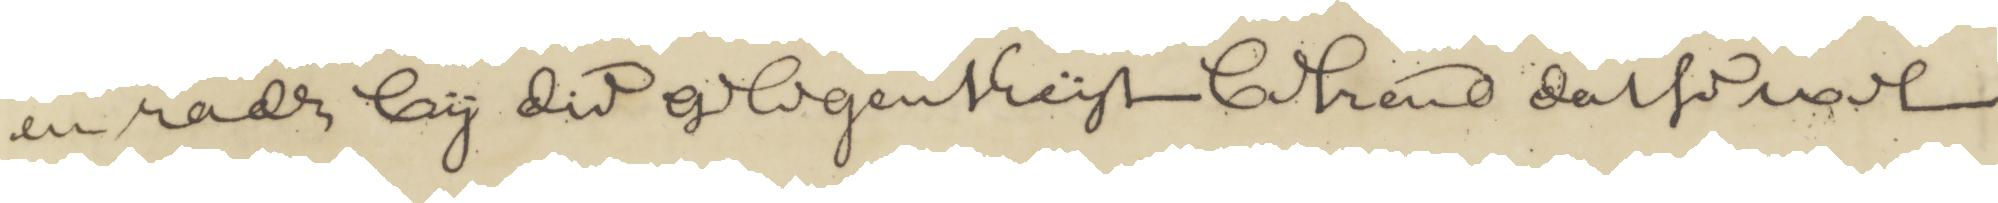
en raden bij die gelegentheijt bekend datse wel
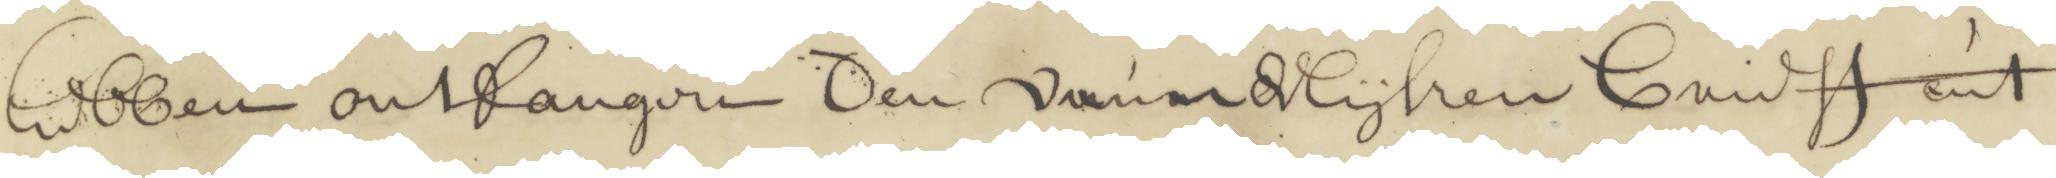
hebben ontfangen den vrundlijken brieff en’t
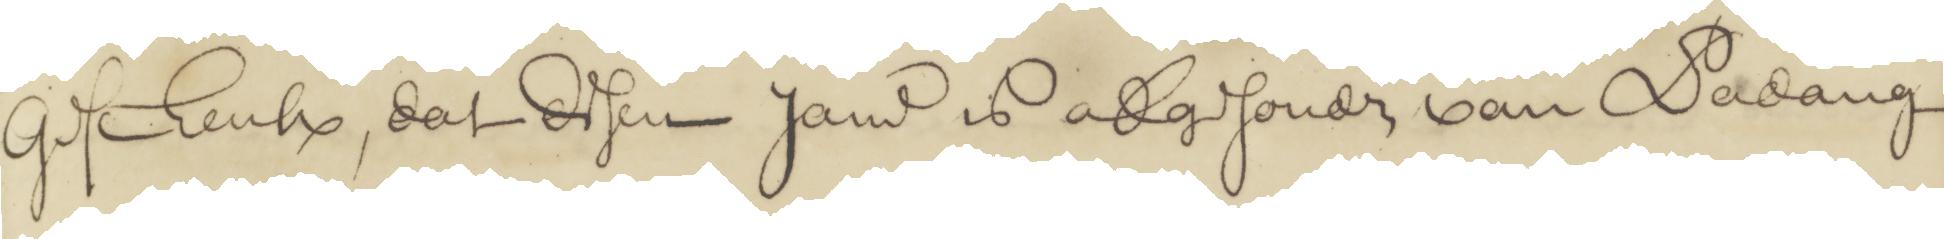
geschenk, dat desen Jare is afgesonden van Badang
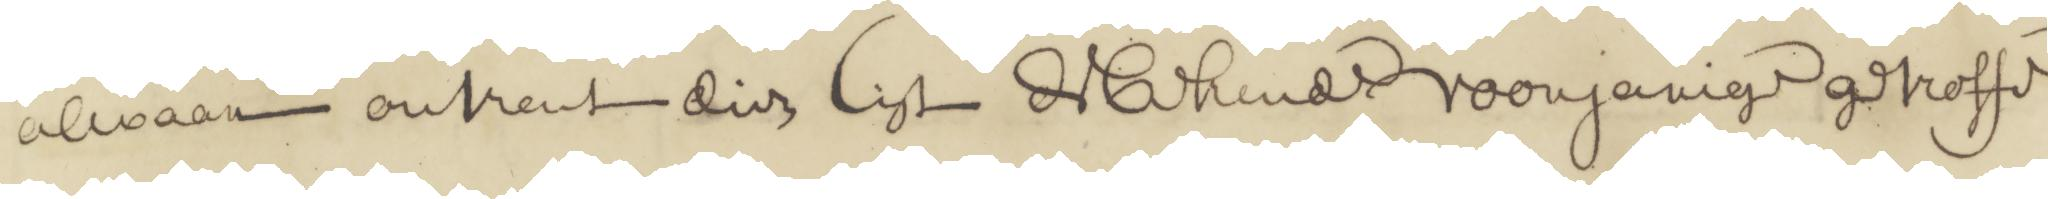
alwaar ontrent dien tijt debekende voorjarige getroffe
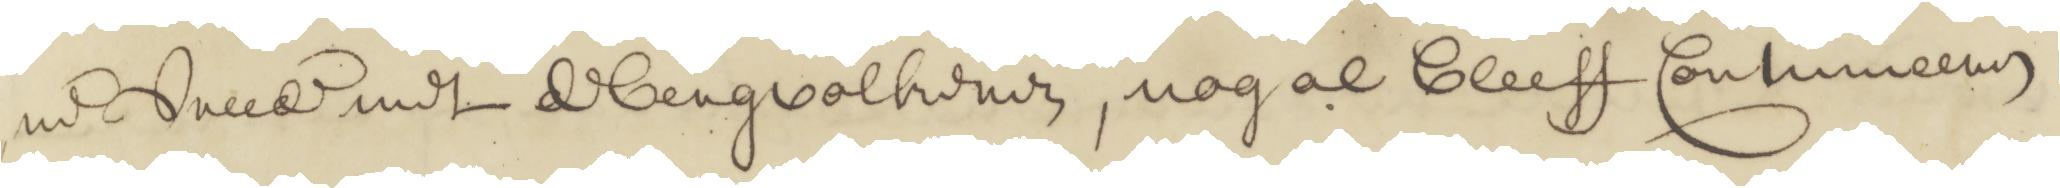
„ne Vreede met de bergvolkeren, nog al bleeff Continueeren
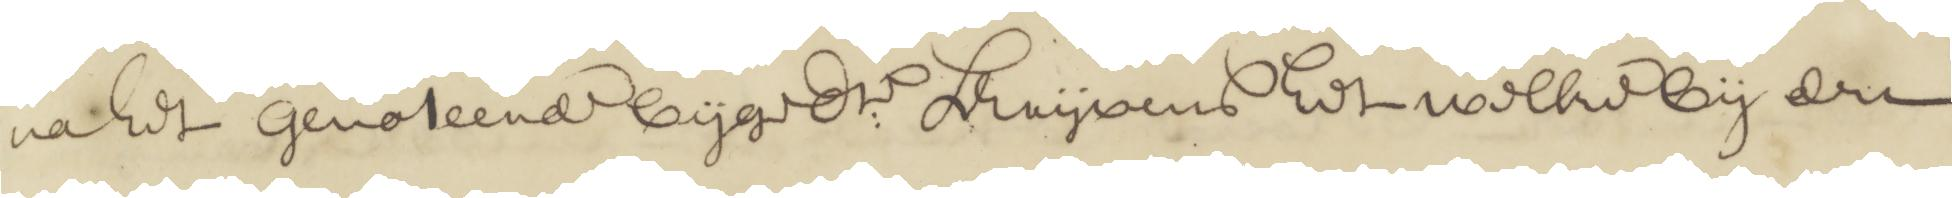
na het genoteerde bijgev:e schrijvens het welke bij den
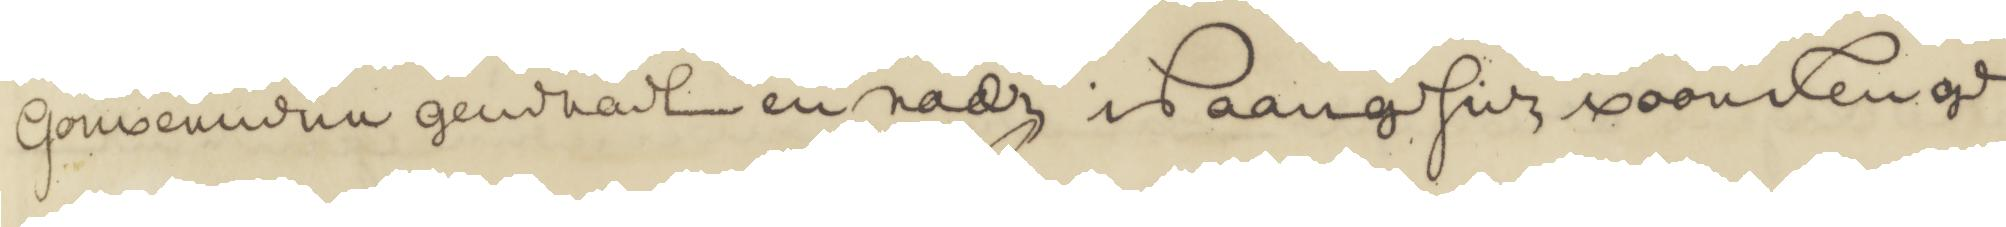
Gouverneur generael en raden is aangesien voor Een ge
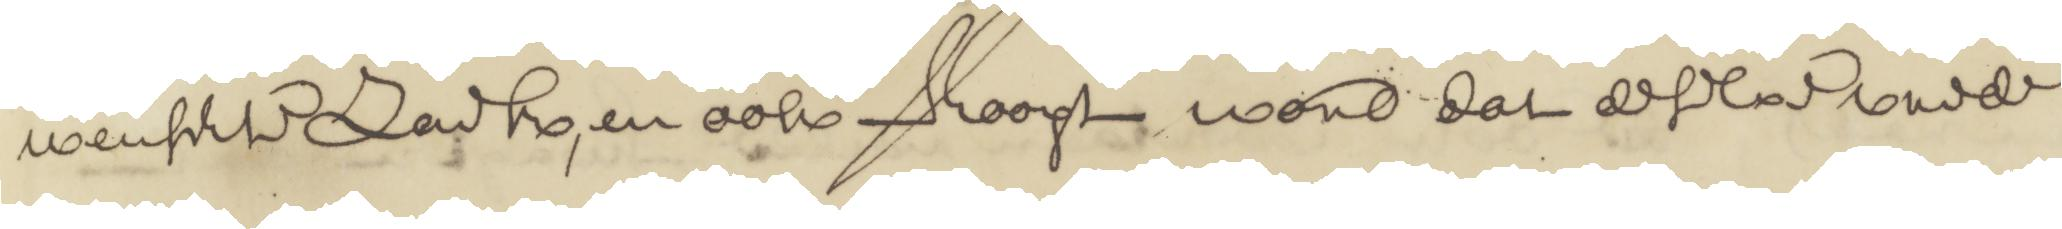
wenschte Zaek, en ook verhoopt word dat deselve vrede
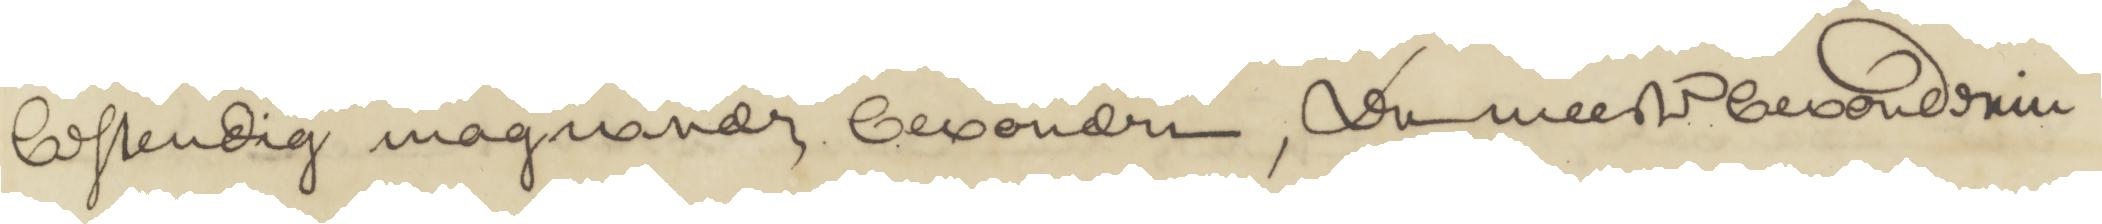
bestendig mag werden bevonden, ter meeste bevordenin
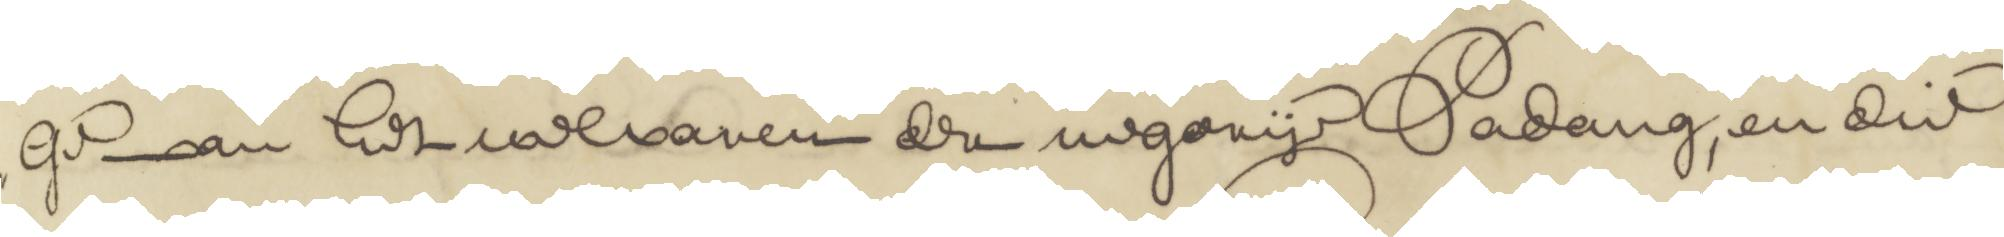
„ge van het welvaren der negorij Padang, en die
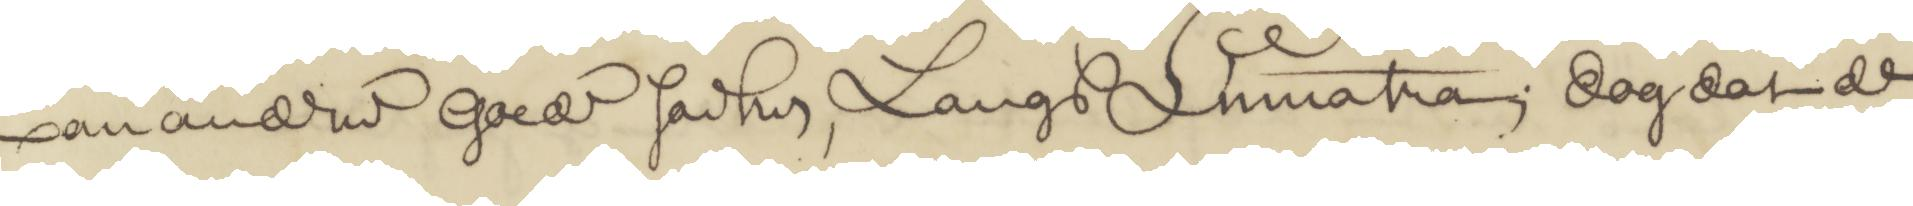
van andere goede saeken, Langs Sumatra; dog dat de
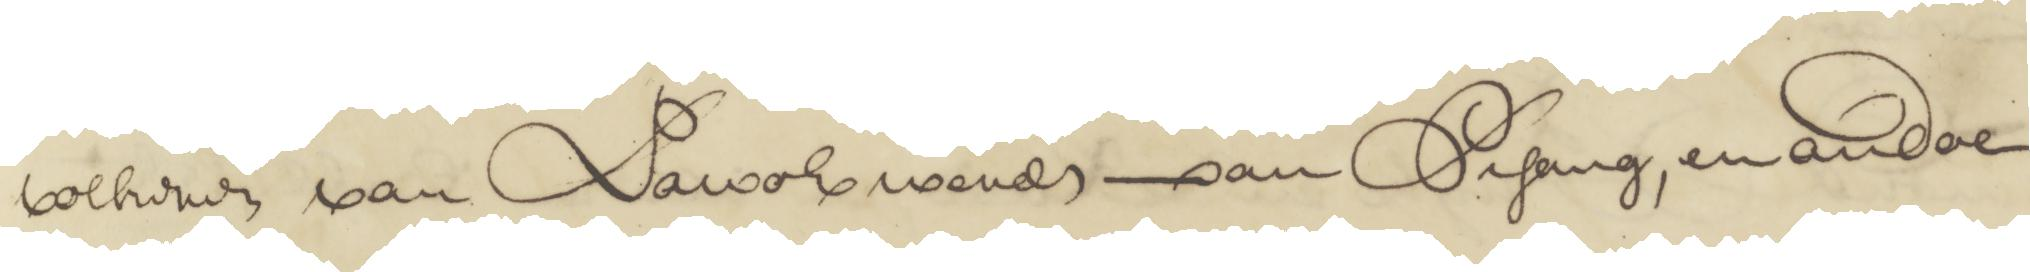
volkeren van Pawoh werden van Pisang en andoe
